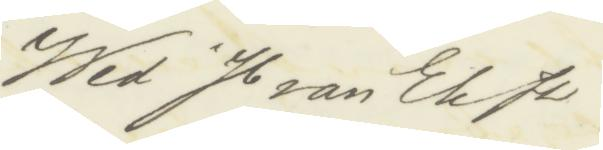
Wed Jb van Ek fz
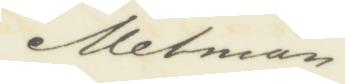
Metman
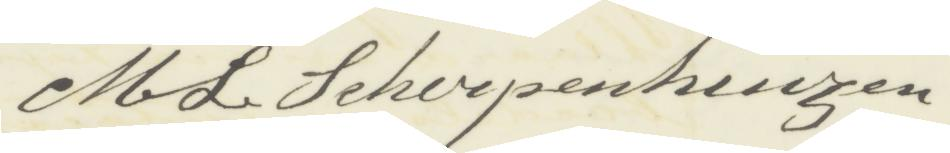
M L. Scherpenhuizen
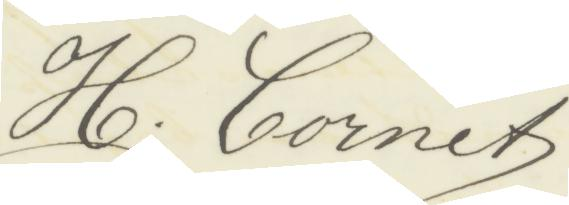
H. Cornet
